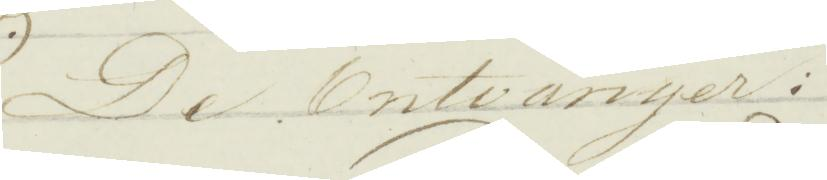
De Ontvanger:
